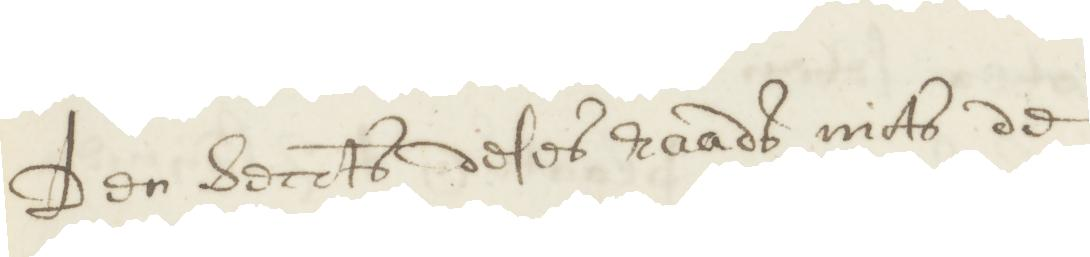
Den secrts deses raads mits de
